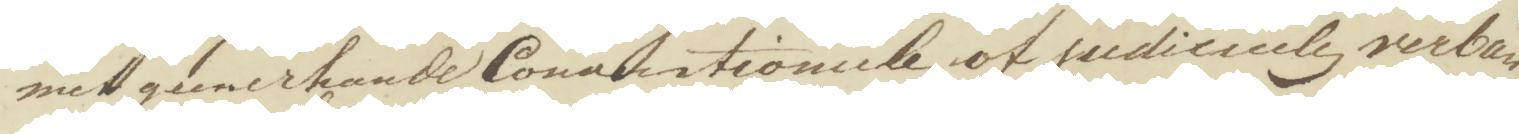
met geenerhande Conventioneele, of judicieele verban
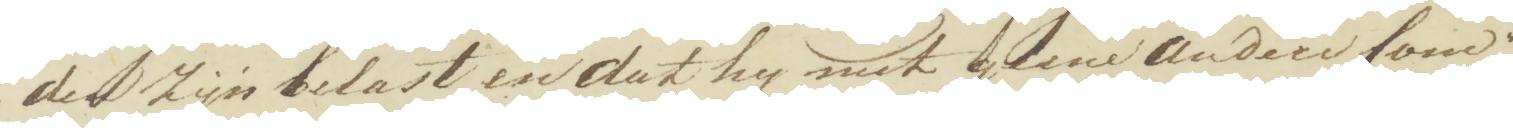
„den zijn belast en dat hy met geene Andere Com„
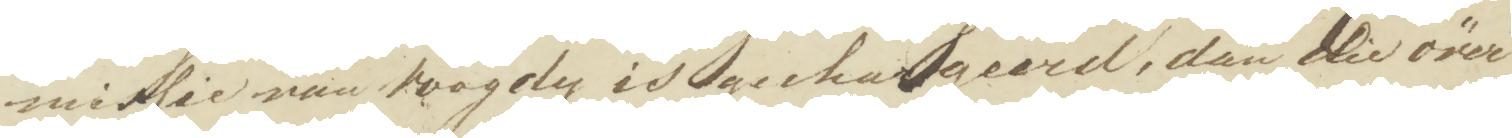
„missie van voogdy is gechargeerd, dan die over
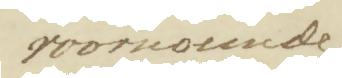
voornoemde
